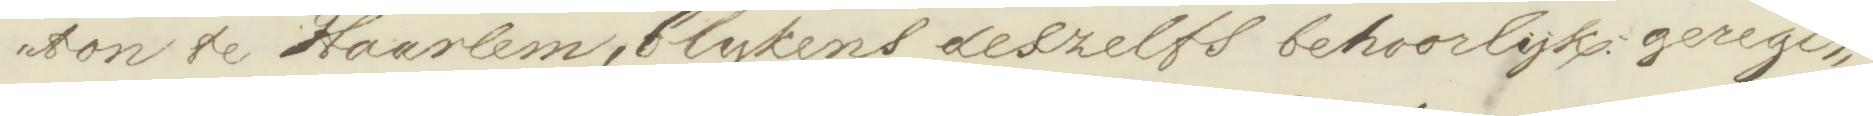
„ton te Haarlem, blykens deszelfs behoorlijk geregi„
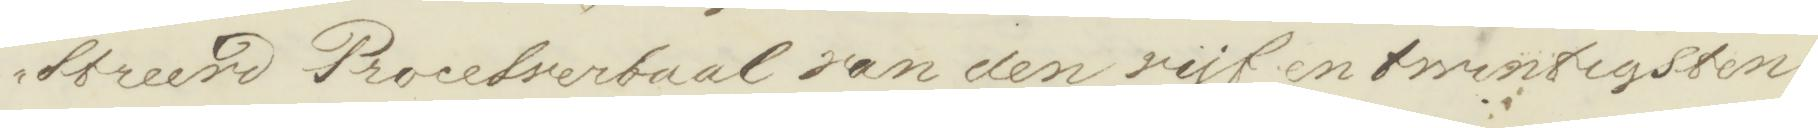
„streerd Procesverbaal van den vijf en twintigsten
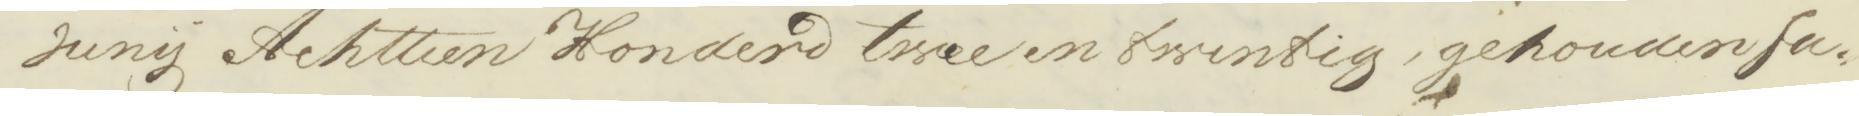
Junij Achttien Honderd twee en twintig, gehouden fa„
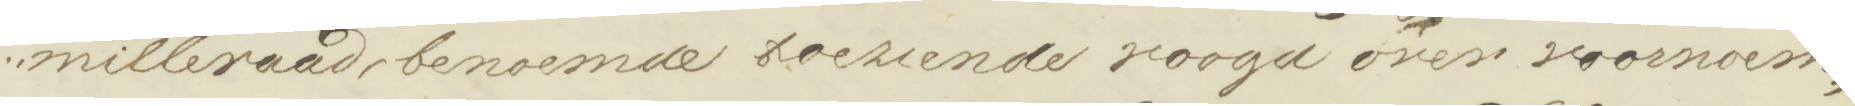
„milleraad, benoemde toeziende voogd over voornoem„
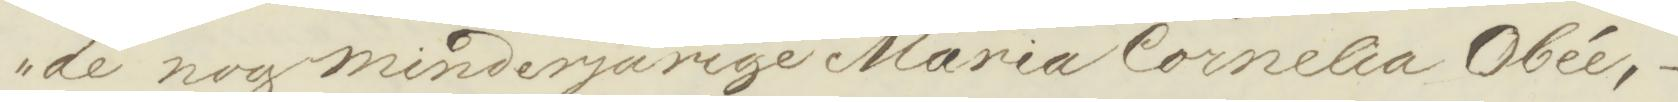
„de nog minderjarige Maria Cornelia Obée,
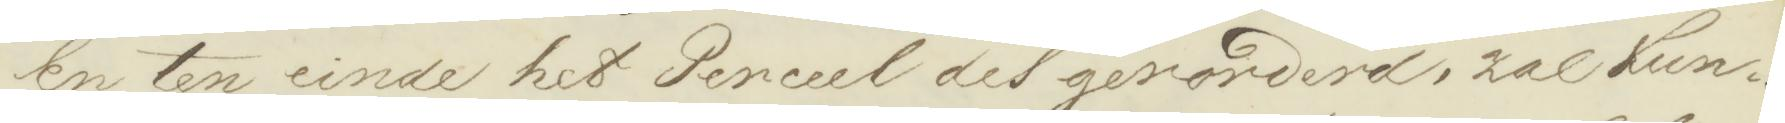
En ten einde het Perceel des gevorderd, zal kun„
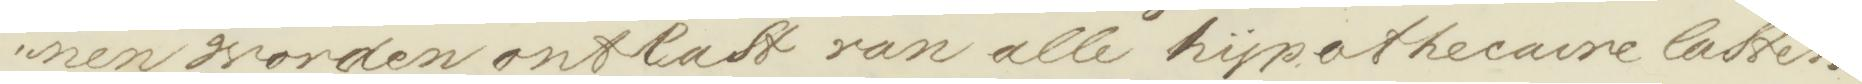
„nen worden ontlast van alle hijpothecaire lasten
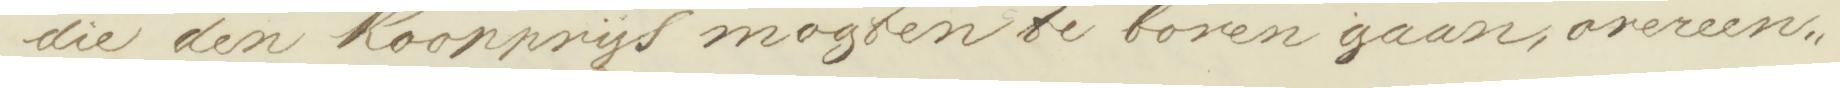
die den Koopprijs mogten te boven gaan, overeen„
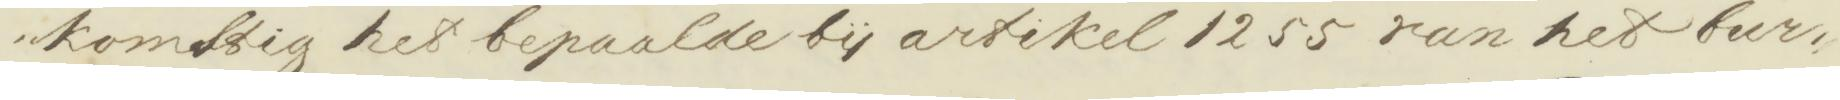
„komstig het bepaalde bij artikel 1255 van het bur„
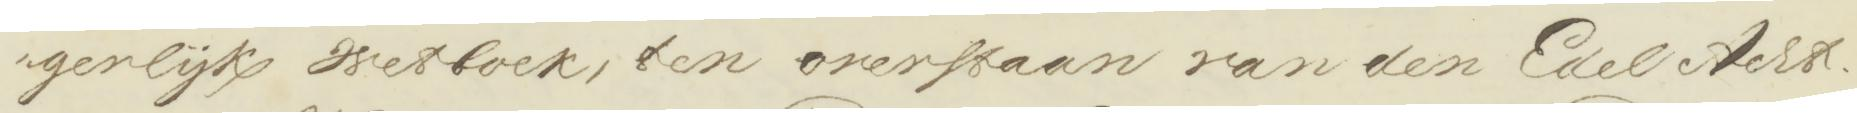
„gerlijk Wetboek, ten overstaan van den Edel Acht.
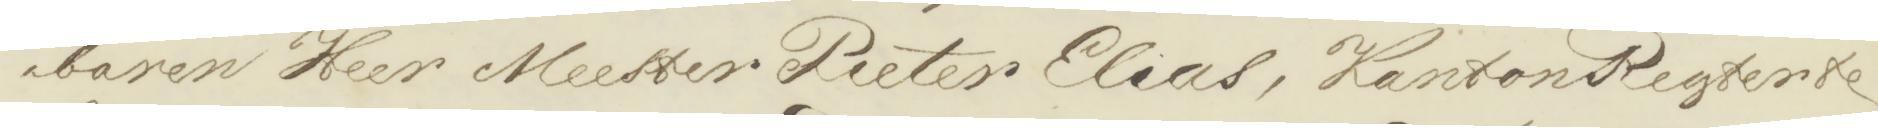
baren Heer Meester Pieter Elias, KantonRegter te
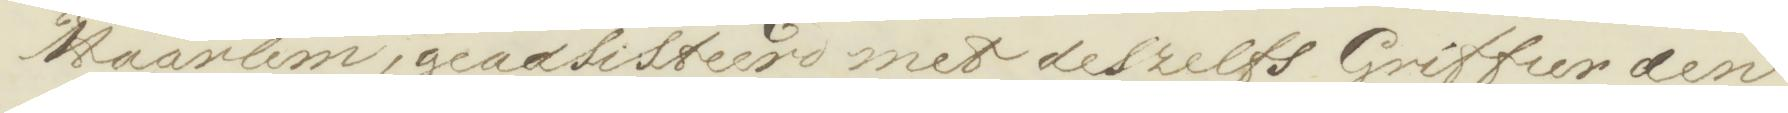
Haarlem, geadsisteerd met deszelfs Griffier den
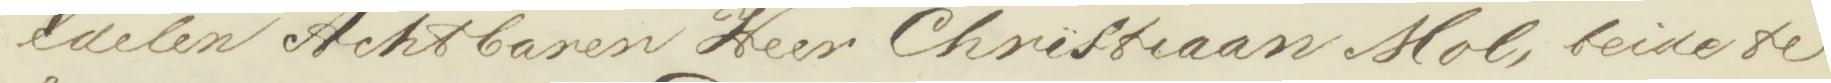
Edelen Achtbaren Heer Christiaan Mol, beide te
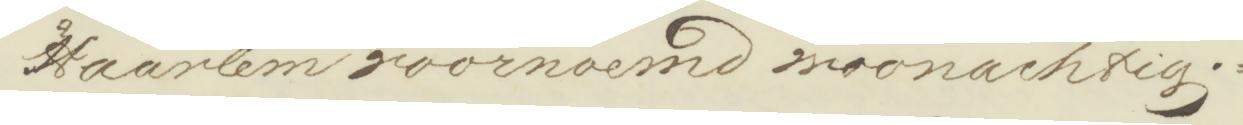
Haarlem voornoemd woonachtig.
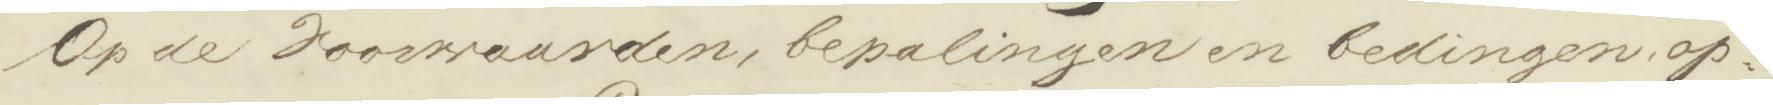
Op de voorwaarden, bepalingen en bedingen, op„
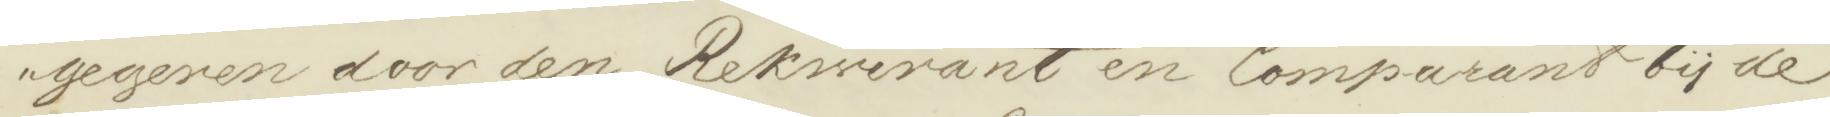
„gegeven door den Rekwirant en Comparant bij de
